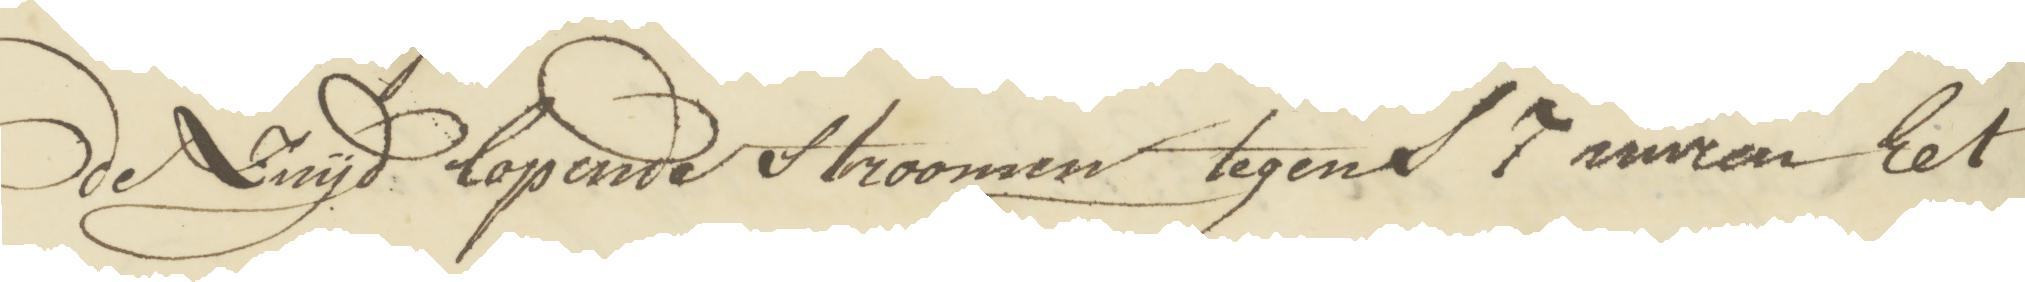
de zuijd lopende stroomen tegens 7 uuren het
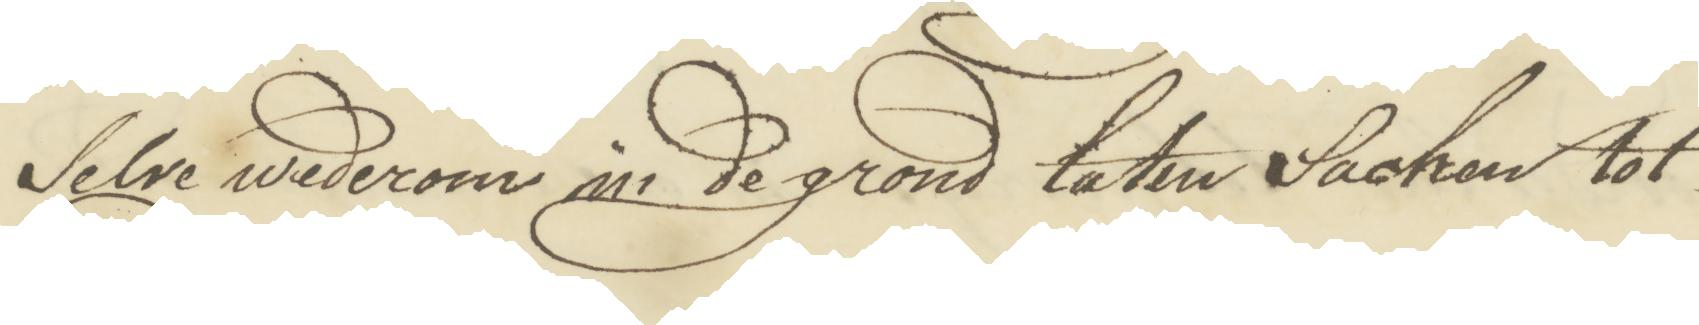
selve wederom in de grond laten sacken tot
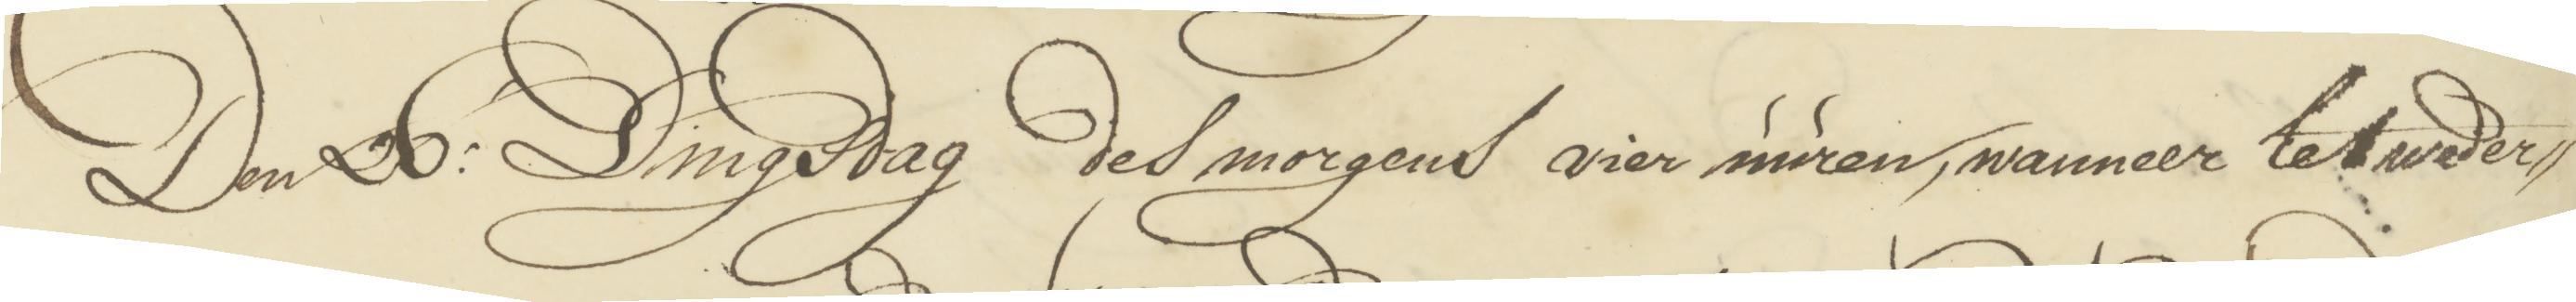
Den 26: Dingsdag des morgens vier uuren, wanneer het weder„
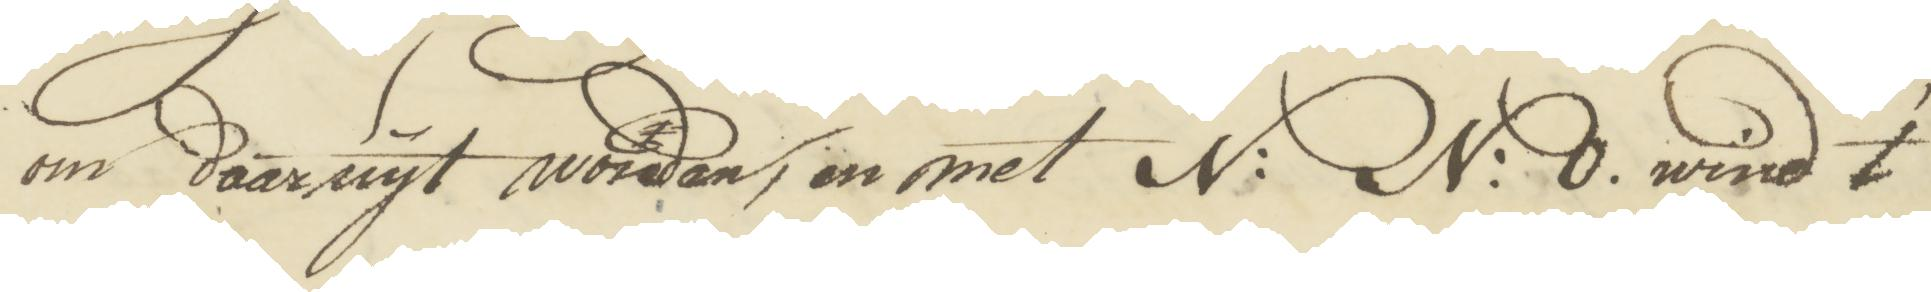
om daar uijt worden, en met N: N: O. wind ’t
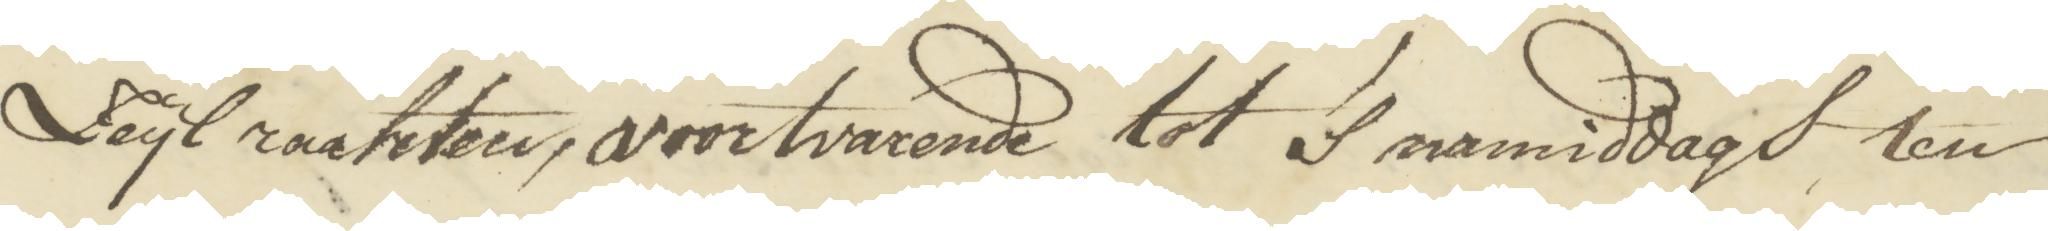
Zeijl raakten, voortwarende tot 's namiddags ten
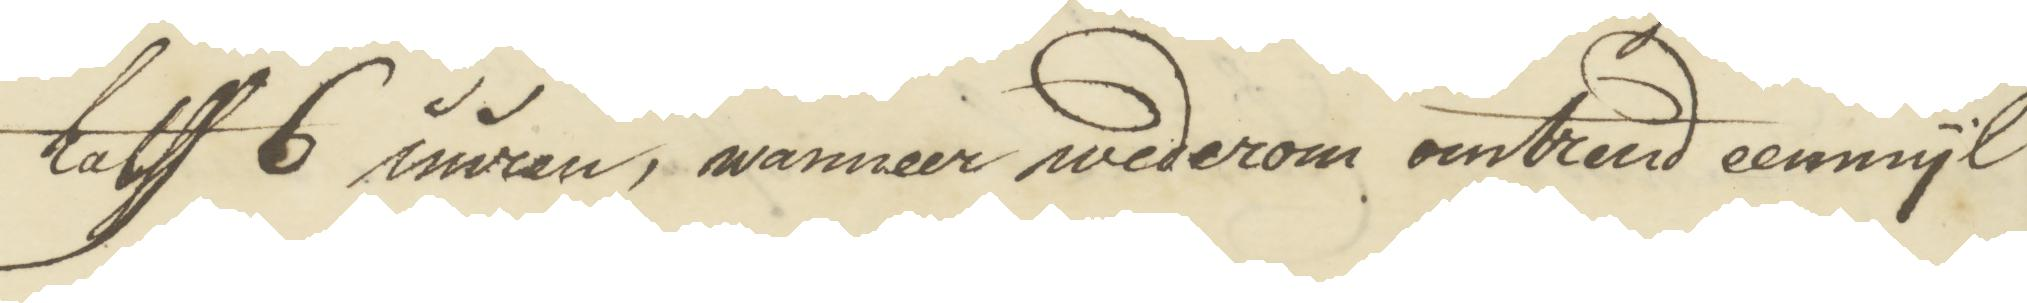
halff 6 uuren, wanneer wederom omtrend eenwijl
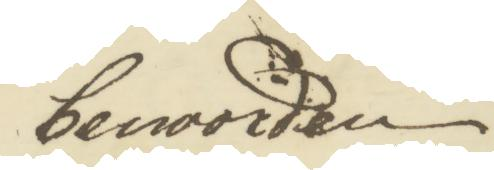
benoorden
